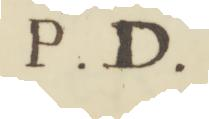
P. D.
